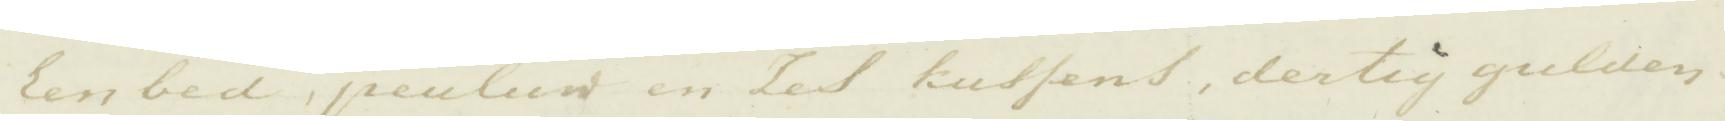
Een bed, peuluw en Zes kussens, dertig gulden
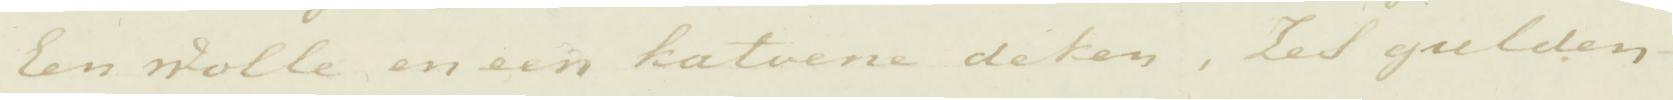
Een wolle en een katoene deken, Zes gulden
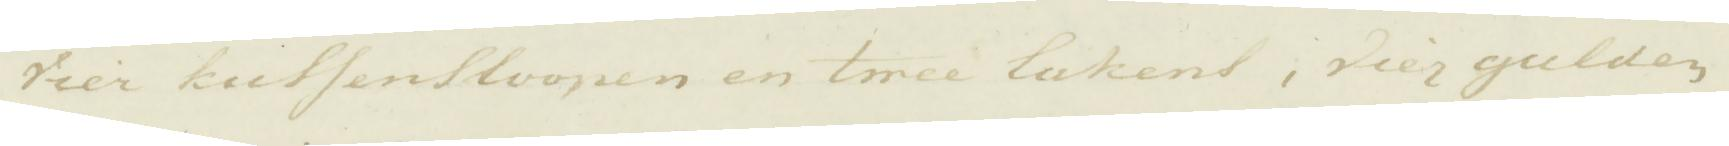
Vier kussensloopen en twee lakens; vier gulden
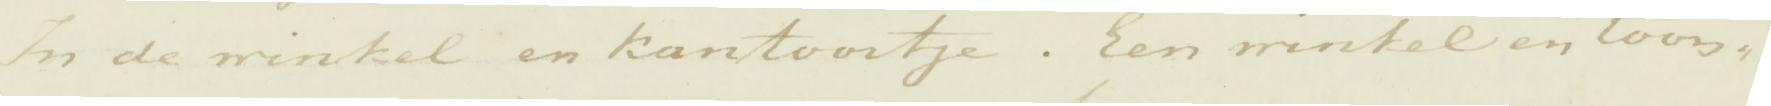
In de winkel en kantoortje, Een winkel en toon„
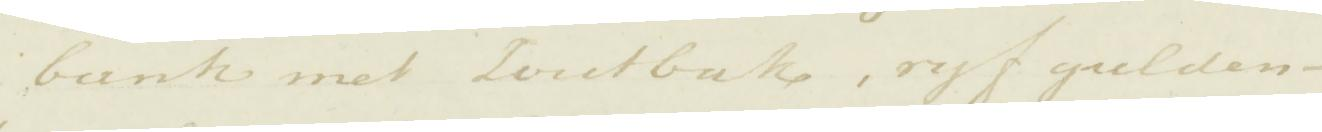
bank met Loutbak, vyf gulden
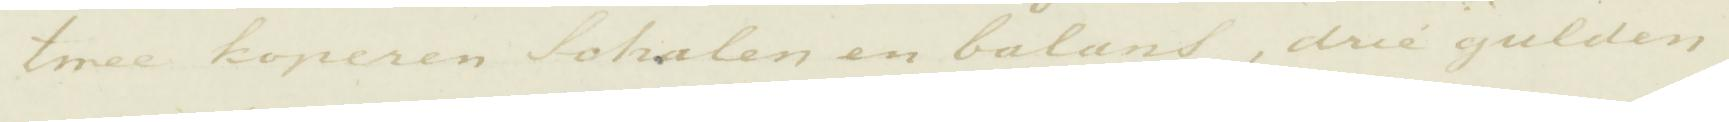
twee koperen schalen en balans, drie gulden
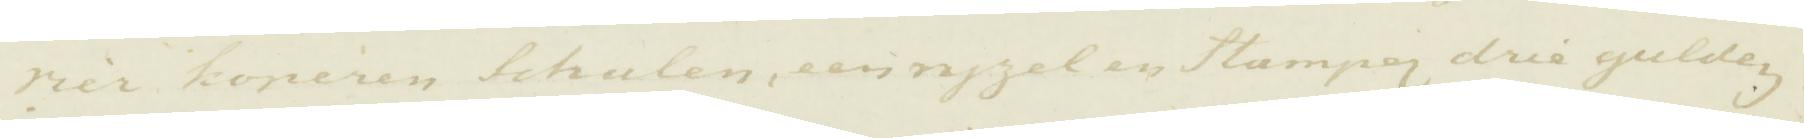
vier koperen schalen, een vyzel en stampen drie gulden
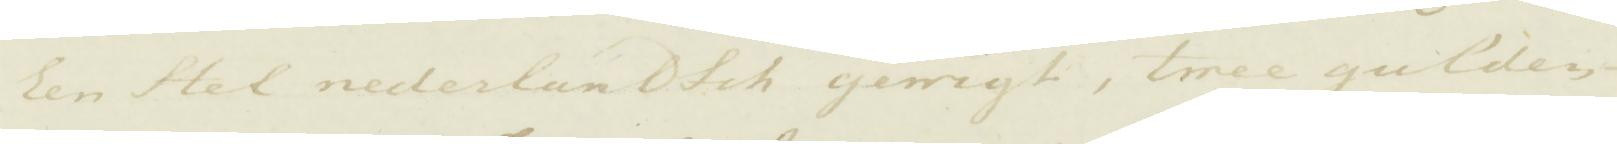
Een stel nederlandsch gewigt, twee gulden
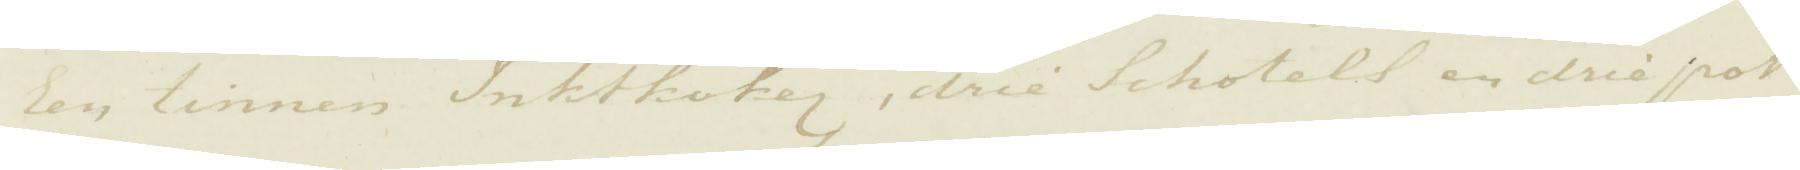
Een tinnen Inkthoker, drie schotels en drie pot
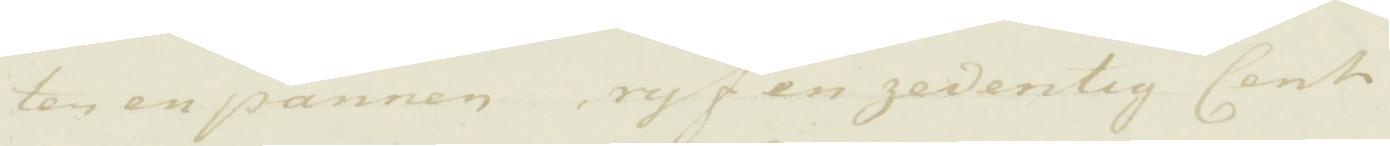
ten en pannen, vyf en zeventig Cent
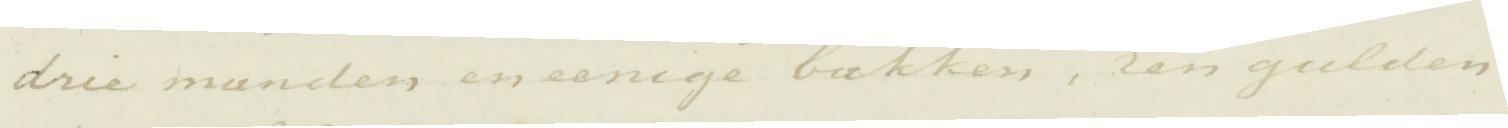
drie manden en eenige bakken, Een gulden
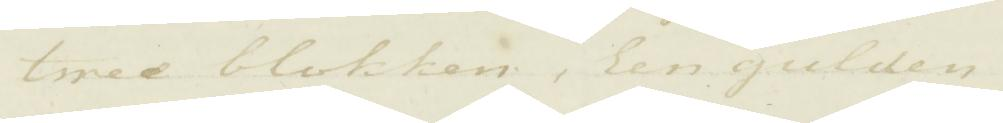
twee blokken, Een gulden
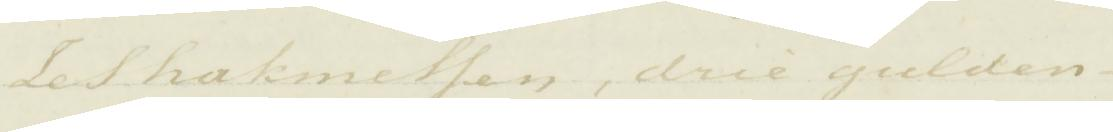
Zes hakmessen, drie gulden
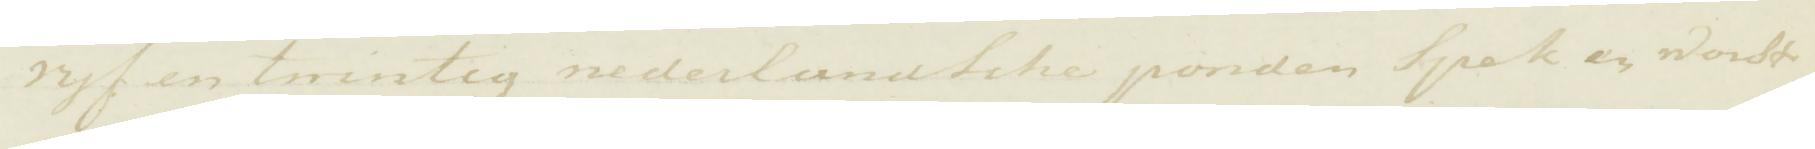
vyf en twintig nederlandsche ponden spek en worst
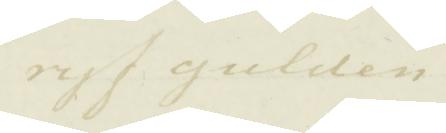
vyf gulden
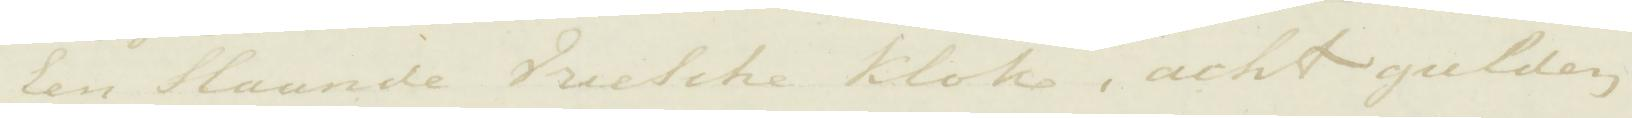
Een slaande Vriesche klok, acht gulden
